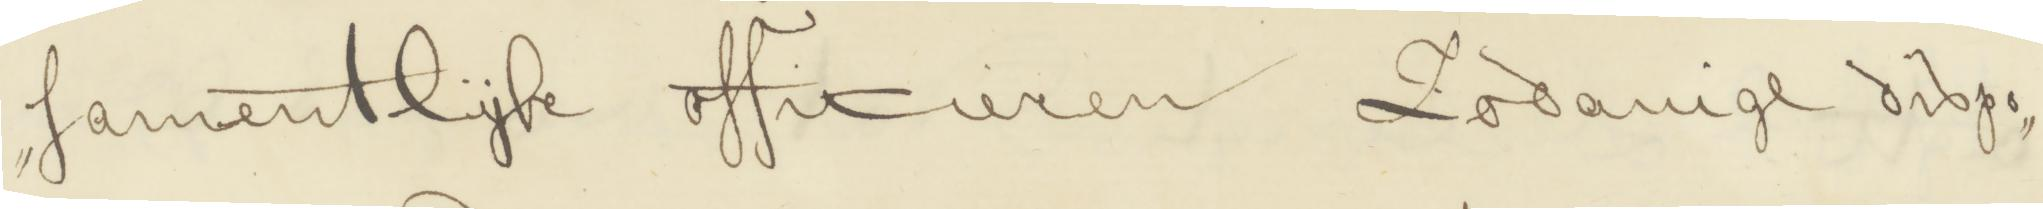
„samentlijk officieren zodanige dispo„
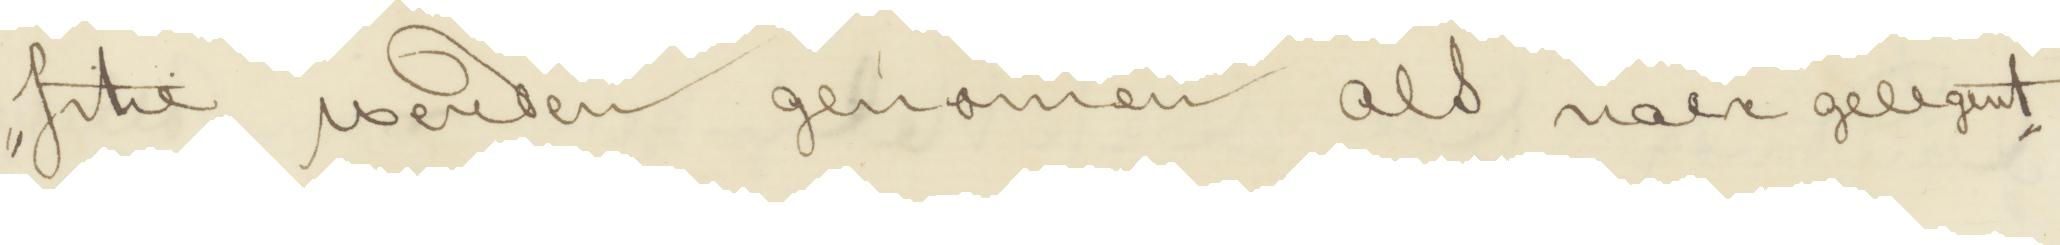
„sitie werden genomen als naer gelegent„
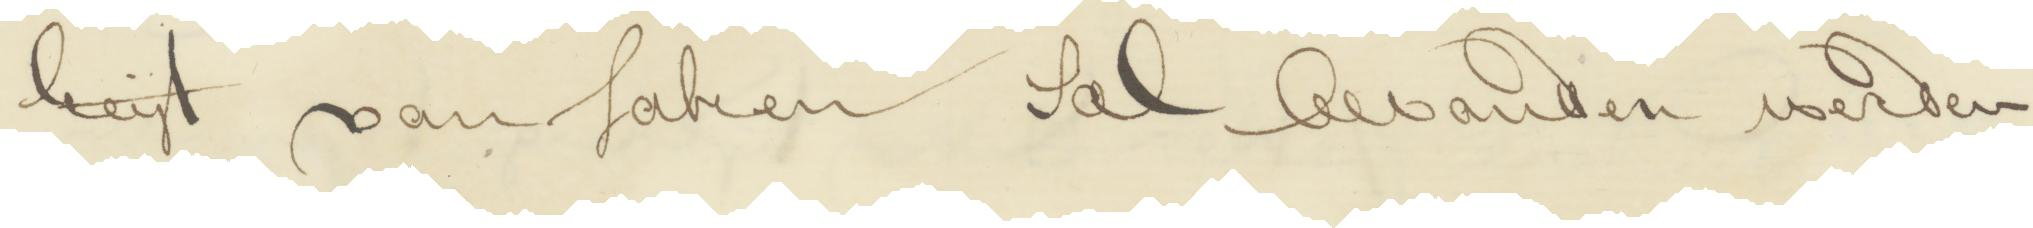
heijt van saken sal bevonden werden
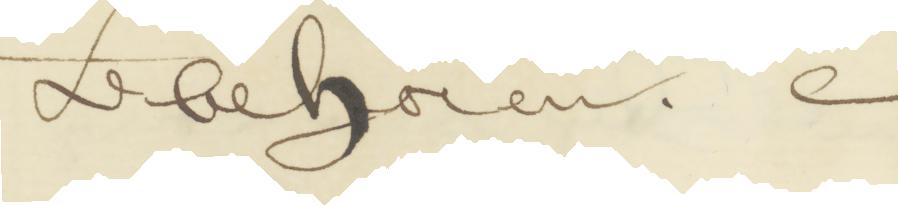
te behoren. —
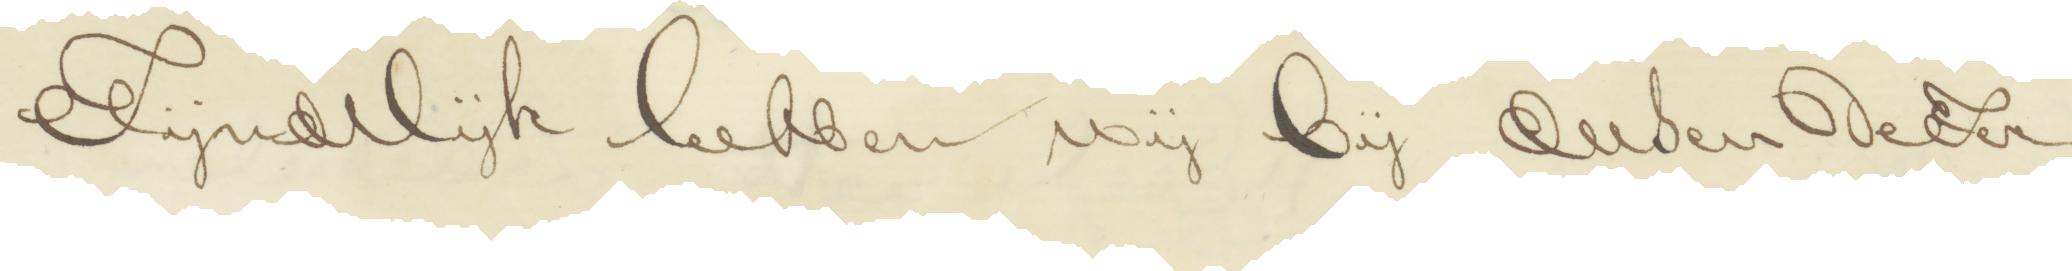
Eijndelijk hebben wij bij deesen de Eer
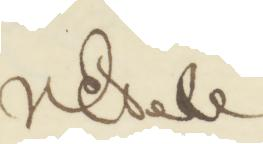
uEdele
